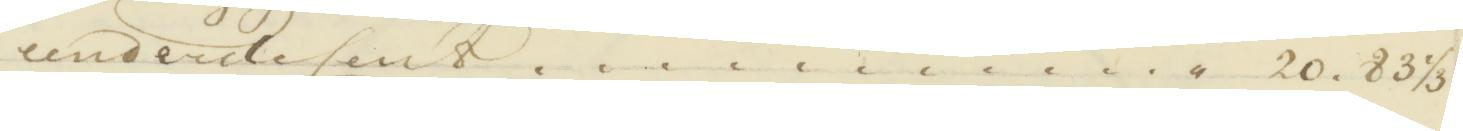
een derde Cent . . . . . . . . . . . „ 20. 83 1/3
